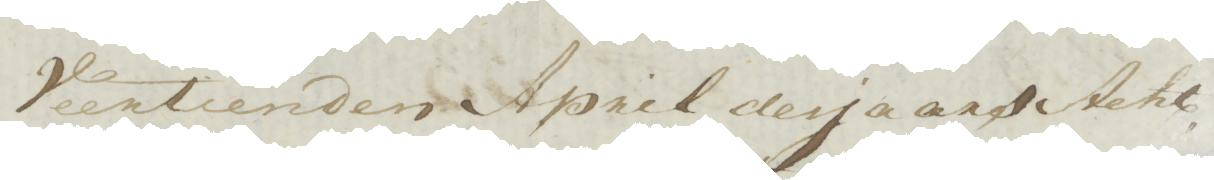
Veertienden April der jaars Acht„
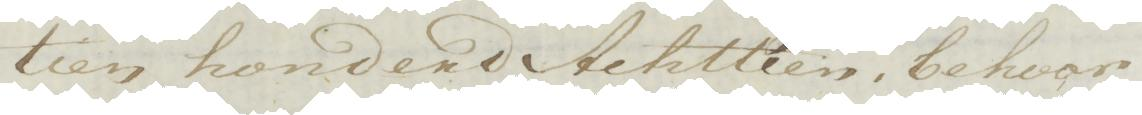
tien honderd Achttien, behoor
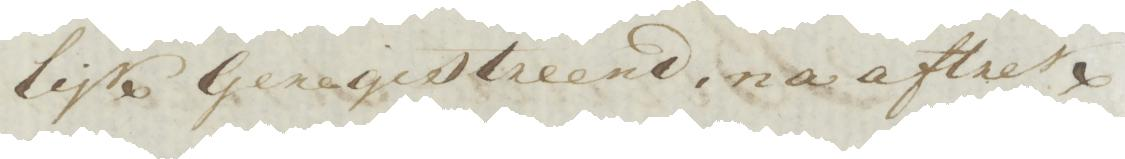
lijk Geregistreerd, na aftrek
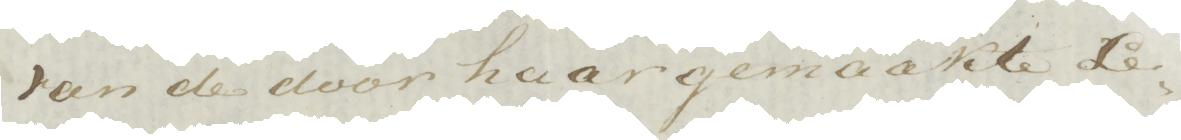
van de door haar gemaakte Le„
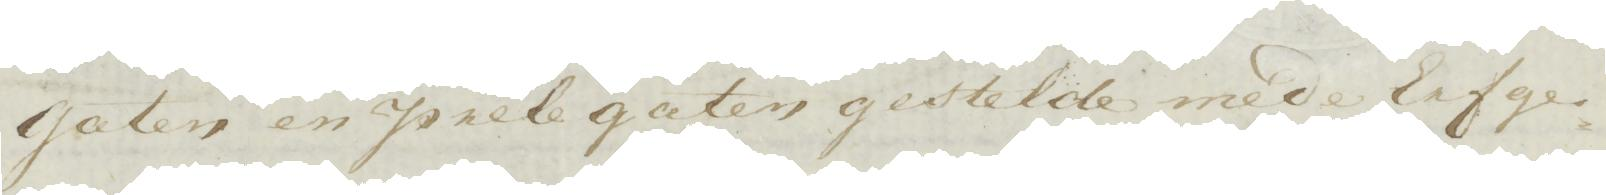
gaten en prelegaten gestelde mede Erfge„
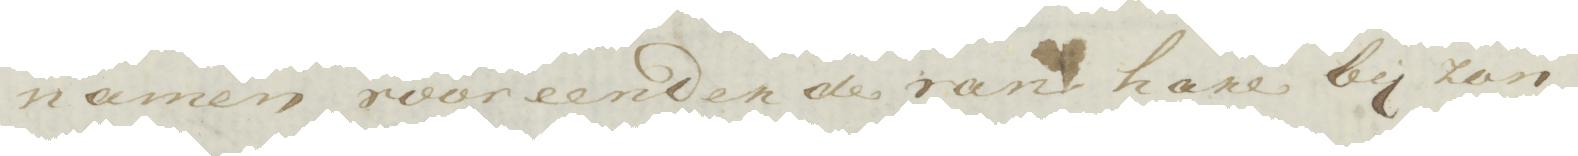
namen voor eender de van hare bij zon
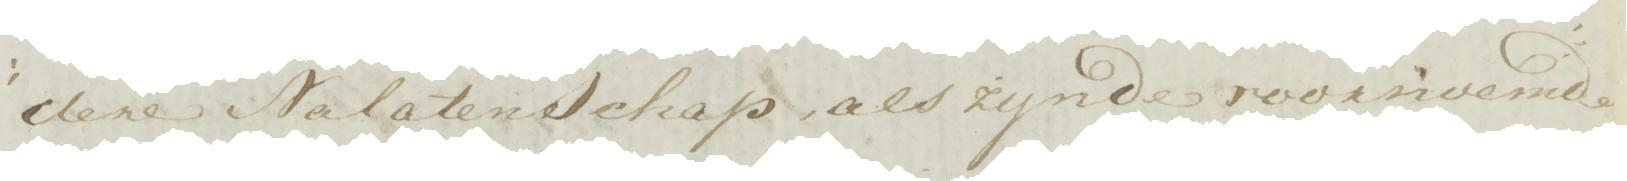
dere Nalatenschap als zynde voornoemde
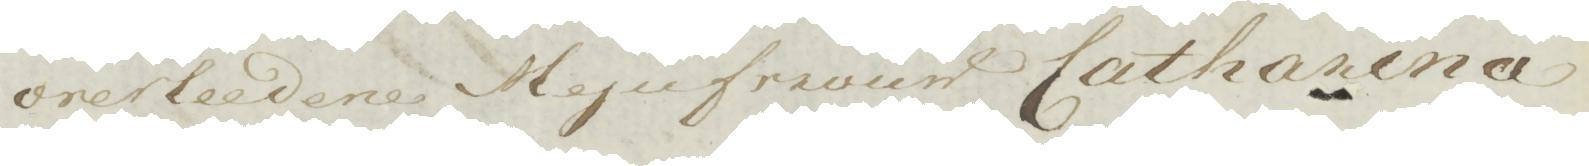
overleedene Mejufvrouw Catharina
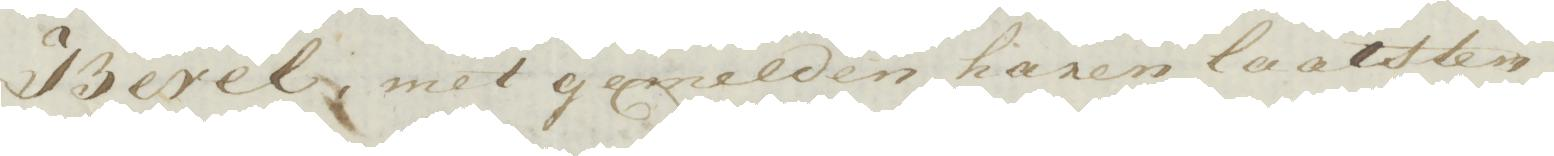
Bevel, met gemelden haren laatsten
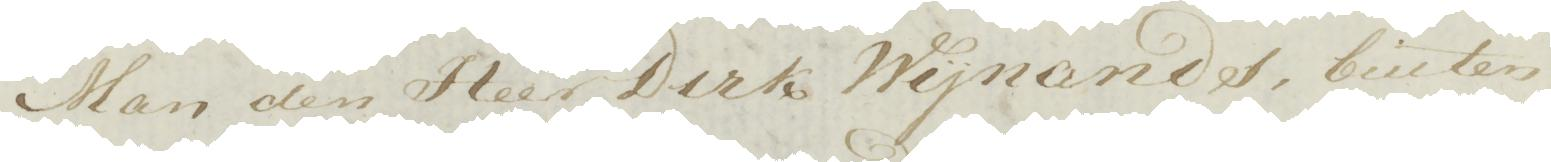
Man den Heer Dirk Wijnands, buiten
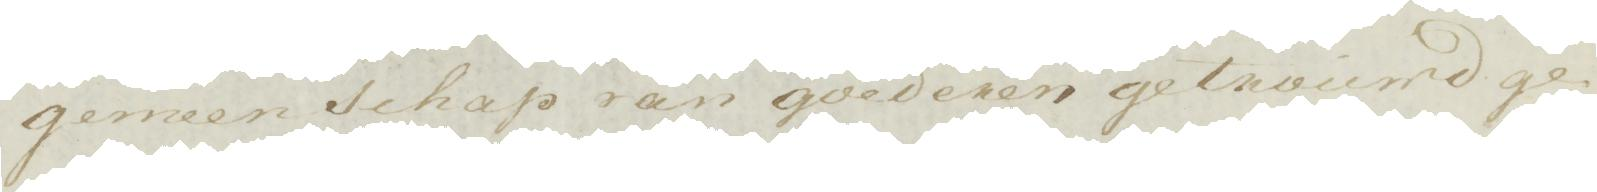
gemeenschap van goederen getrouwd ge
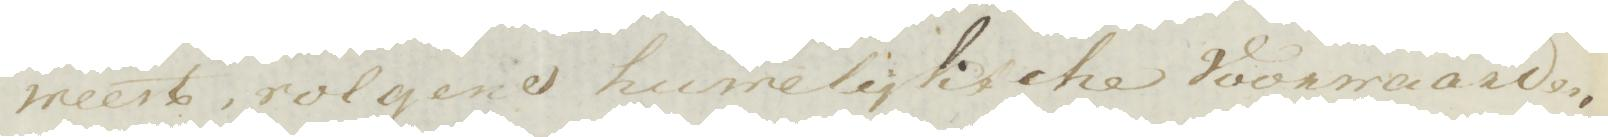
weest, volgens huwelijksche Voorwaarden
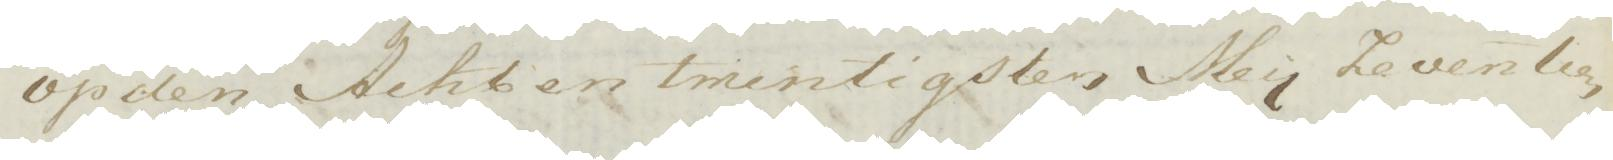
op den Acht en twintigsten Meij zeventien
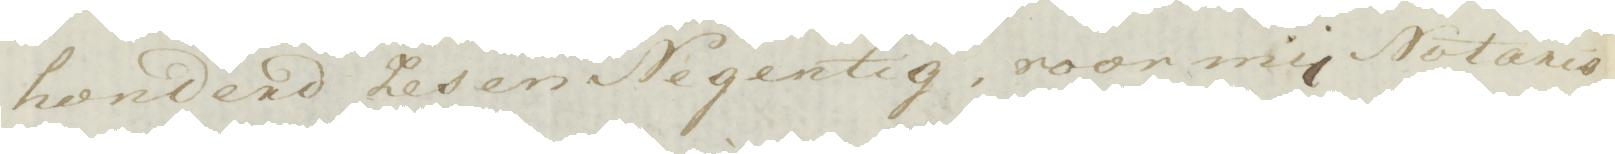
honderd zes en Negentig, voor mij Notaris
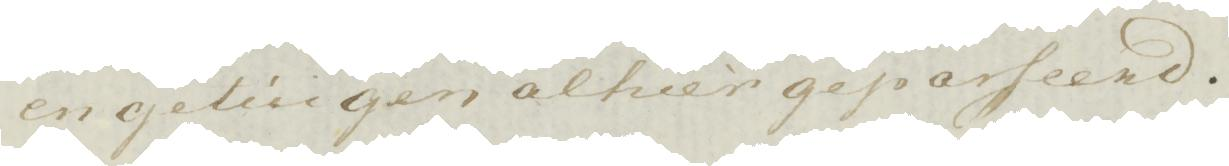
en getuigen alhier gepasseerd.
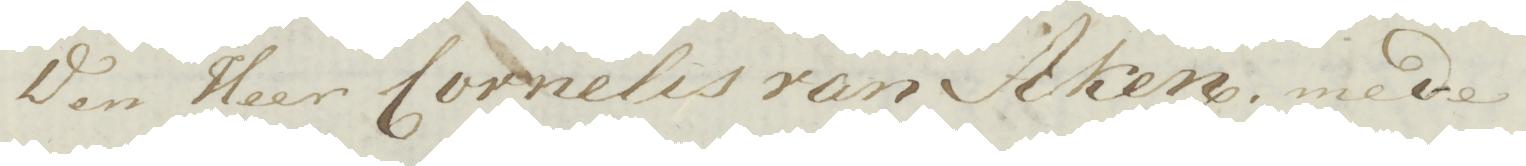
Den Heer Cornelis van Aken, mede
